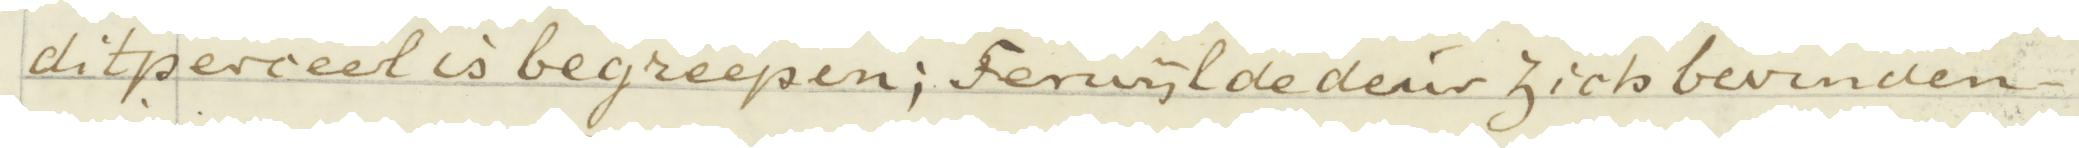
dit perceel is begreepen; Terwijl de deur Zich bevinden-
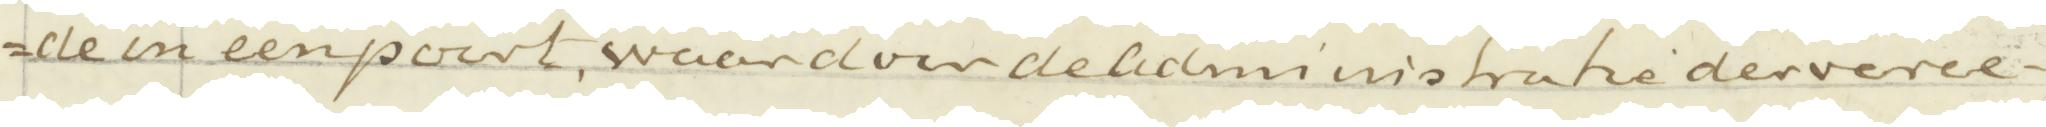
=de in een poort waardoor de administratie der veree-
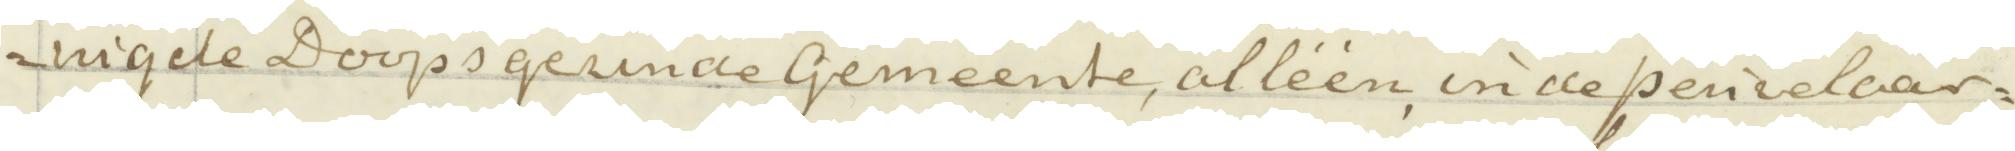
=nigde Doopsgezinde Gemeente, alléén in de peuzelaar=
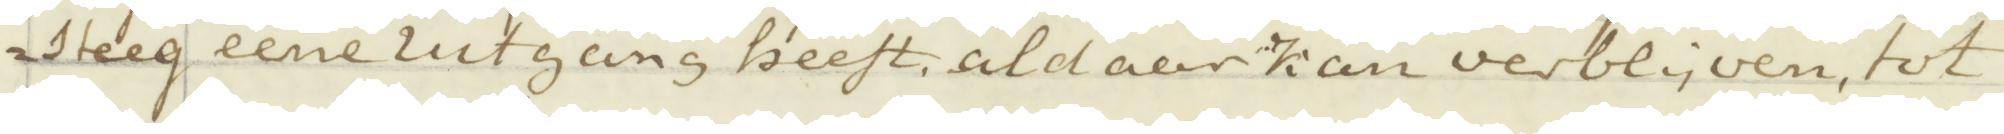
=steeg eene uitgang heeft, aldaar kan verblijven, tot
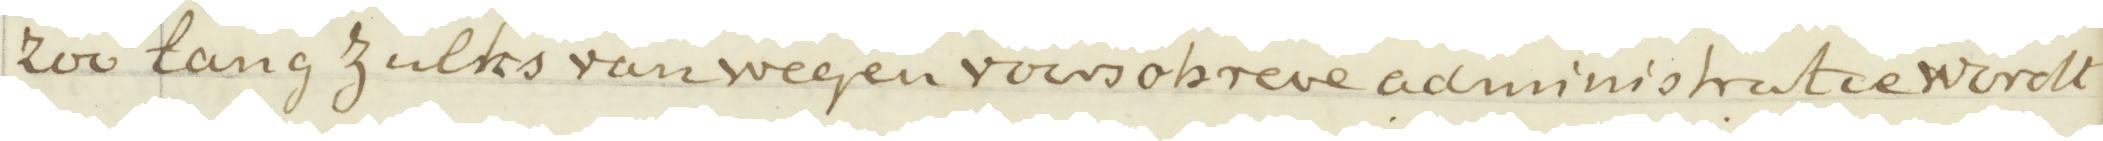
zoo lang Zulks van wegen voorschreve administratie wordt
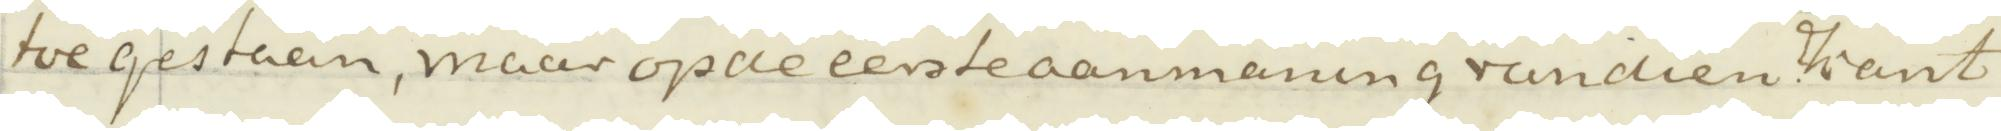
toegestaan, maar op de eerste aanmaning van dien Kant
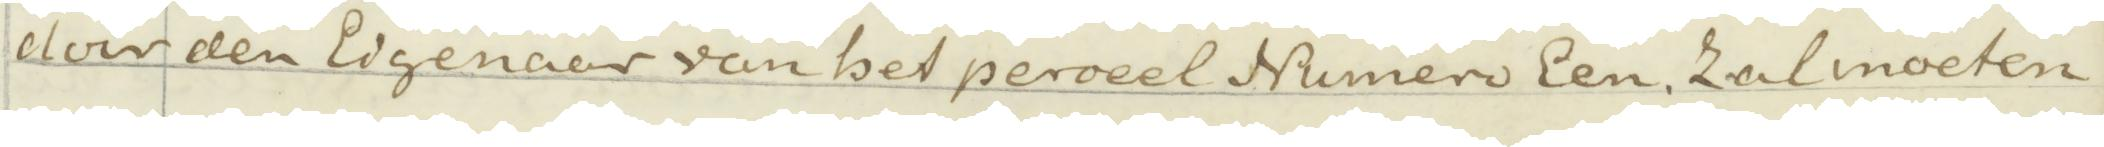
door den Eigenaar van het perceel Numero Een Zal moeten
